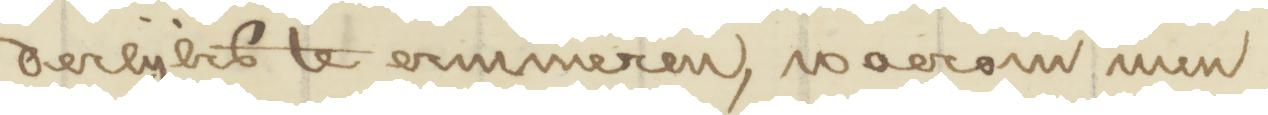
derlijks te ermineren, waerom men
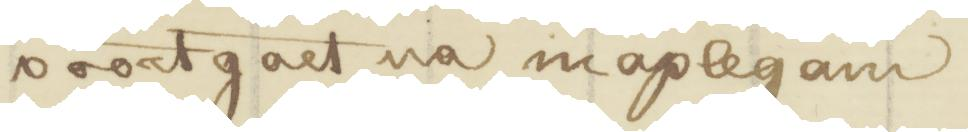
voortgaet na maplegam
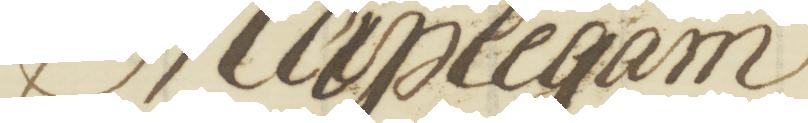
Maplegam
